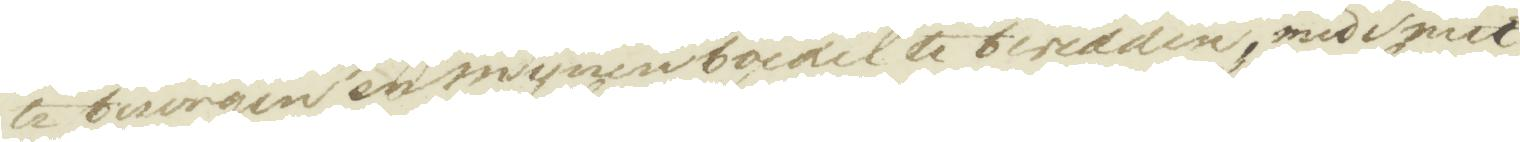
te bezorgen en mynen boedel te beredden, mede met
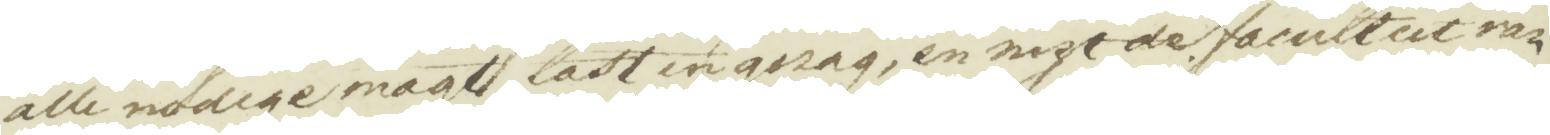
alle nodige magt, last en gezag, en regt de faculteit van
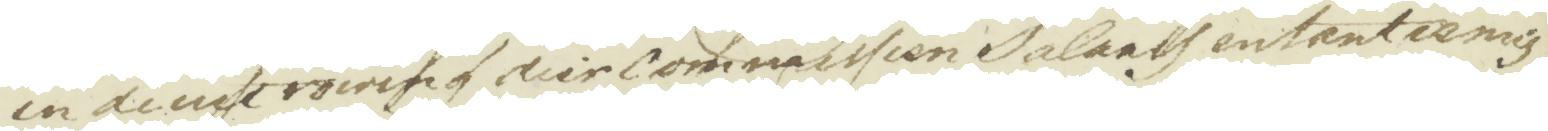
en de uitvoering dier Commissien Salaris intertermis
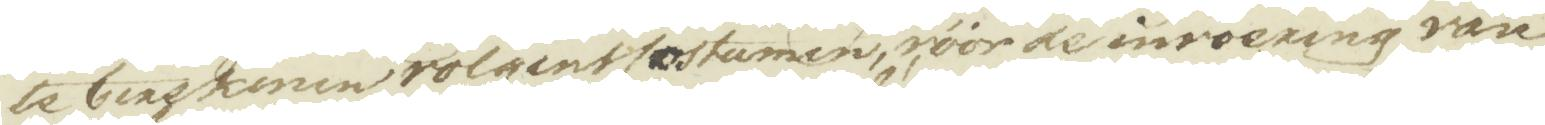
te berekenen volgens Costamen, vóór de invoering van
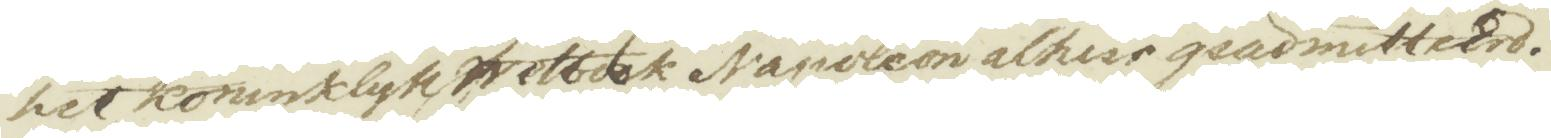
het koninklyk Wetboek Napoleon alhier geadmitteerd.
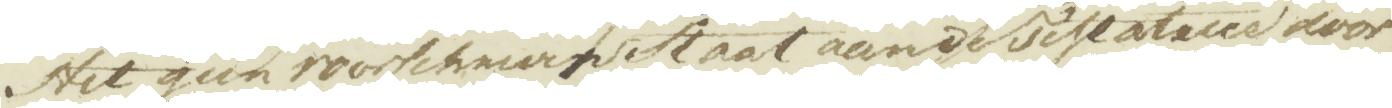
Het geen voorschreven staat aan de Testatrice door
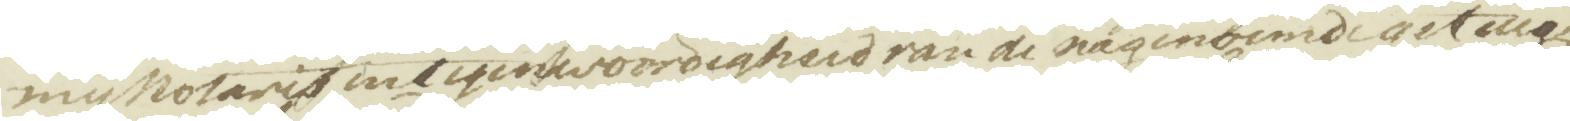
my notaris in tegenwoordigheid van de nagenoemde getuigen
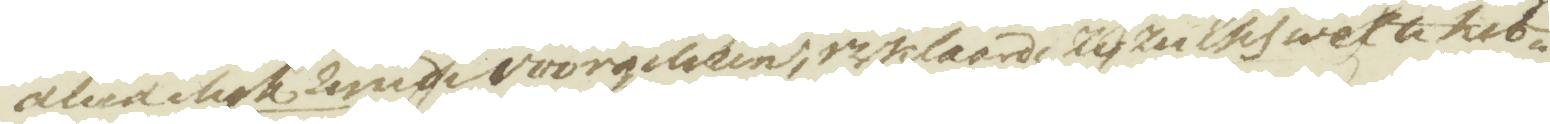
duidelyk zynde voorgelezen, verklaarde zy zulks wel te heb
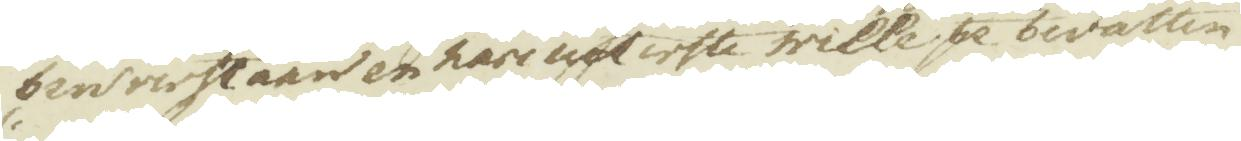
ben verstaan en hare uiterste wille te bevatten
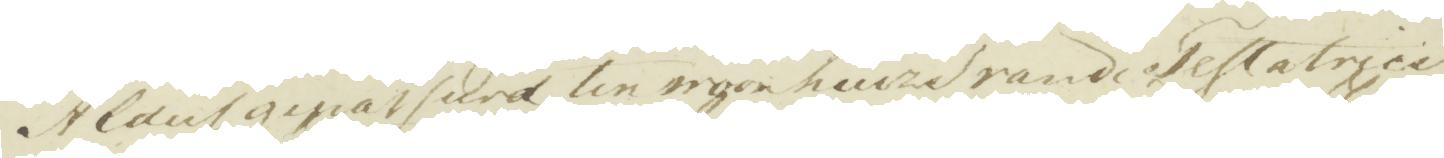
Aldus gepasseerd ten woonhuize van de Testatrice
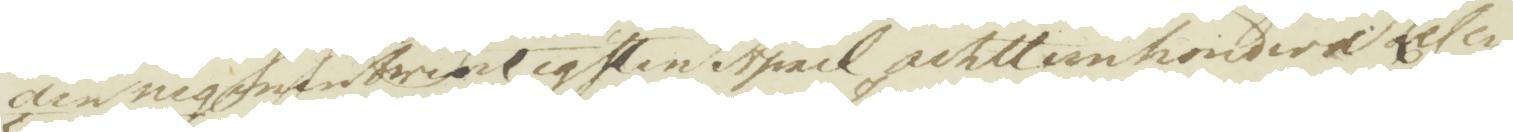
den negenentwintigsten April achtienhonderd zes er
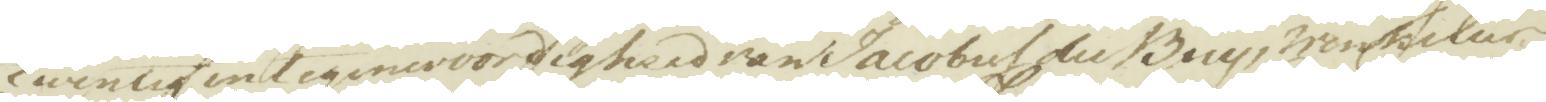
twintig in tegenwoordigheid van Jacobus du Buy, winkelier
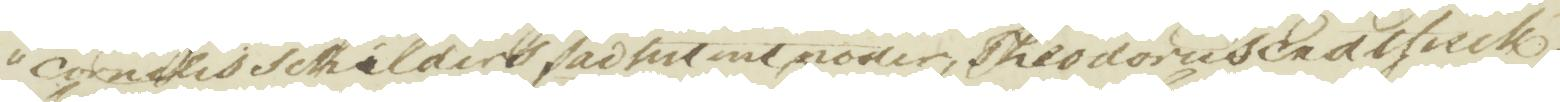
cornelis schilders, adsistent noder, Theodorus Erdtsieck,
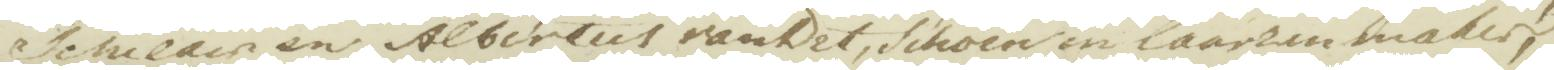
schilder en Albertus van Det, schoen en laarzen maker,
